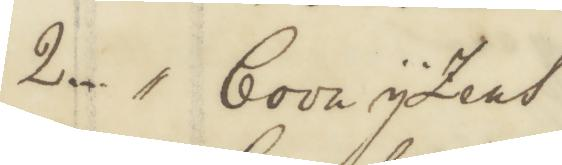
2.-. „ boor ijzers
